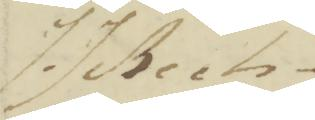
J. J Bech
